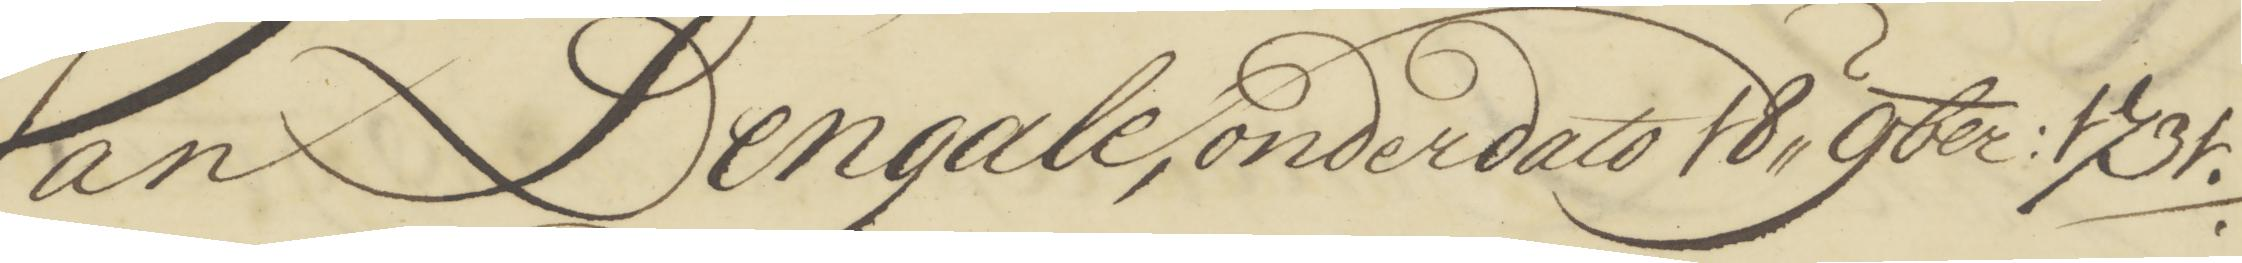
Van Bengale, onder dato 18„ 9ber: 1731.
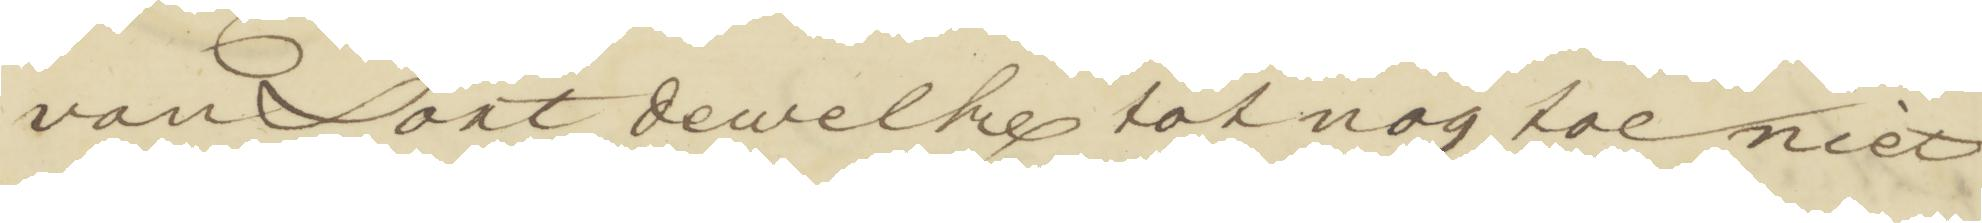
van Dort dewelke tot nog toe niet
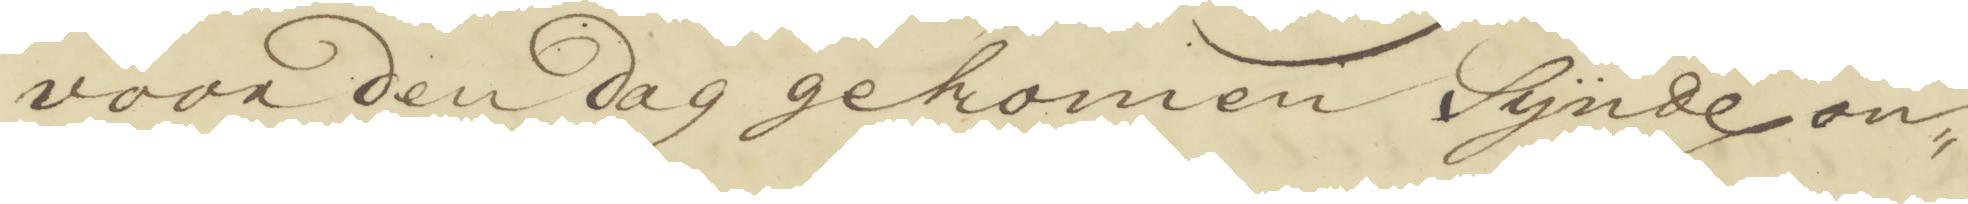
voor den dag gekomen sijnde on„
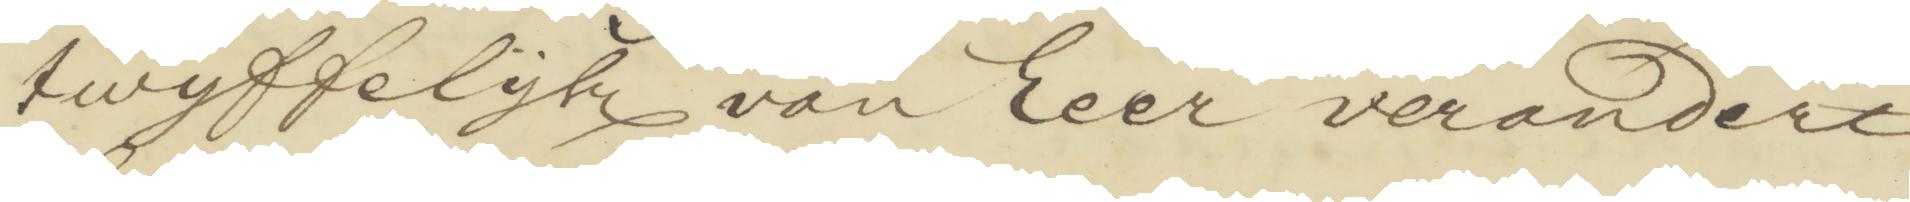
twijffelijk van heer verandert
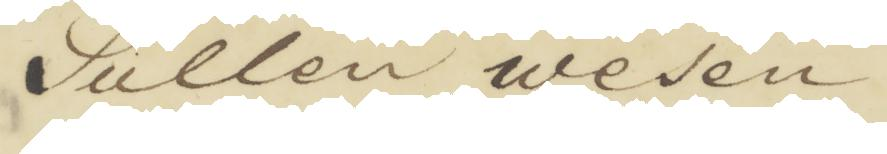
sullen wesen
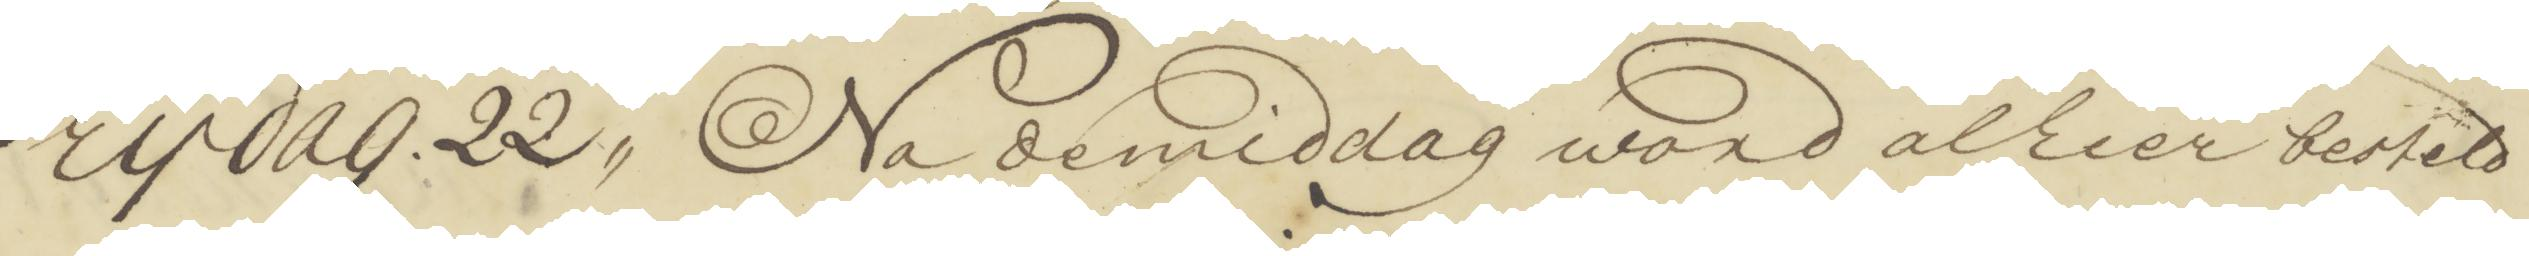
Vrijdag 22„' Na de middag word alhier besteld
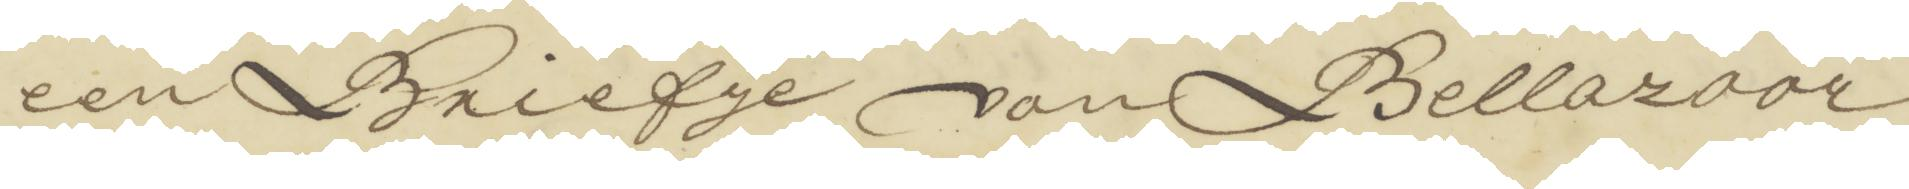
een Briefje van Bellazoor
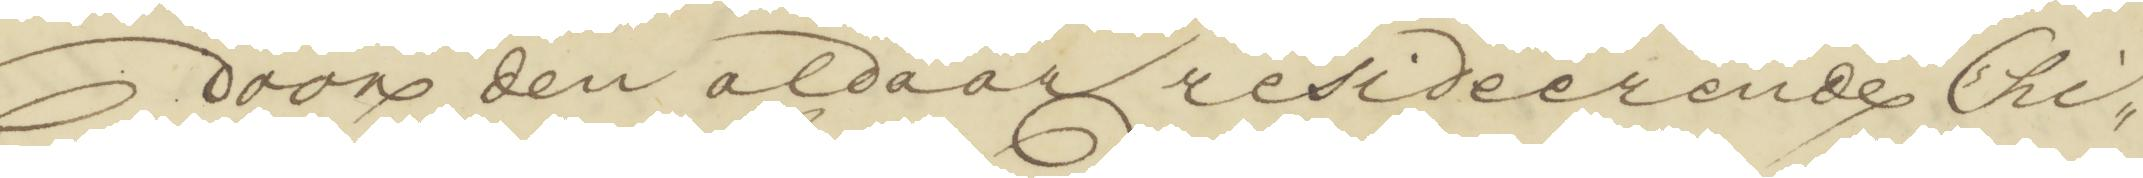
door den aldaar resideerende Chi„
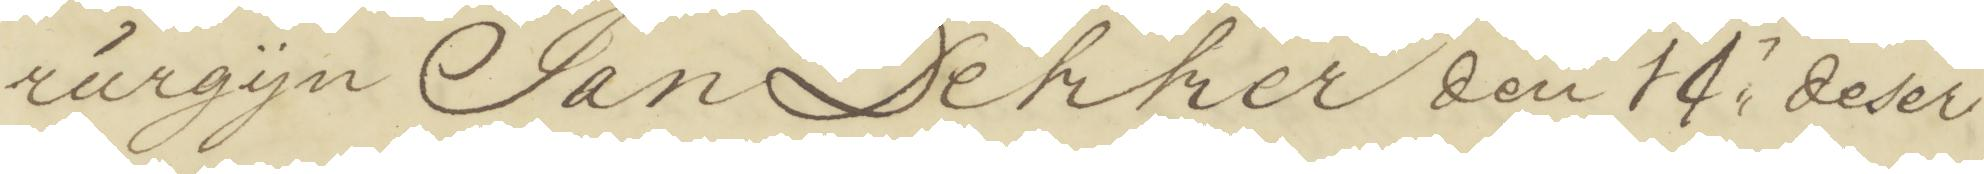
rurgijn Jan Dekker den 14„' deser
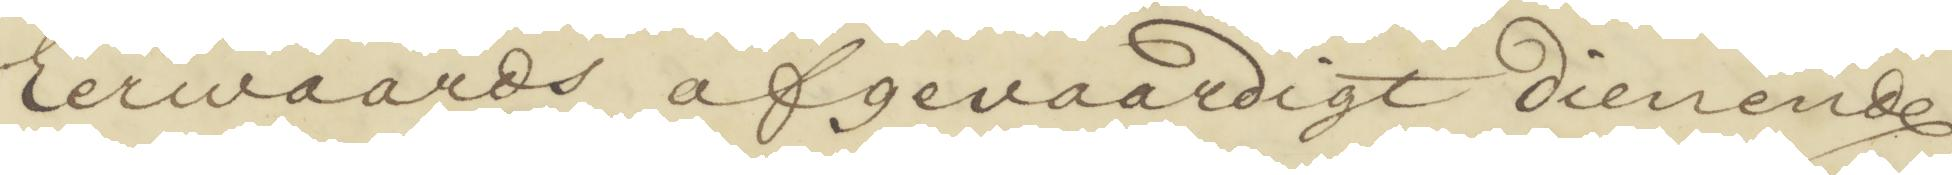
herwaards afgevaardigt dienende
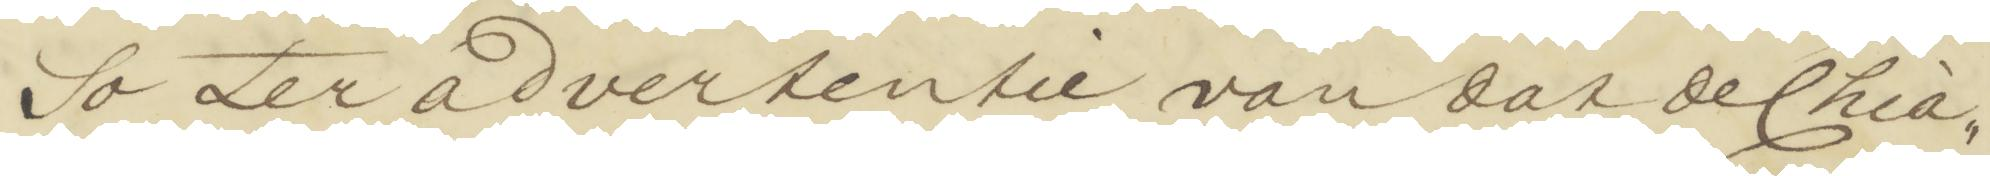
so ter advertentie van dat de Chia
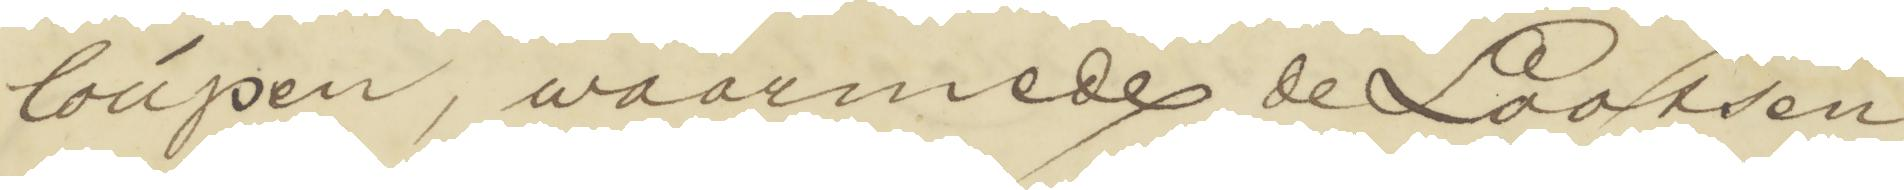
loupen, waarmede de Lootsen
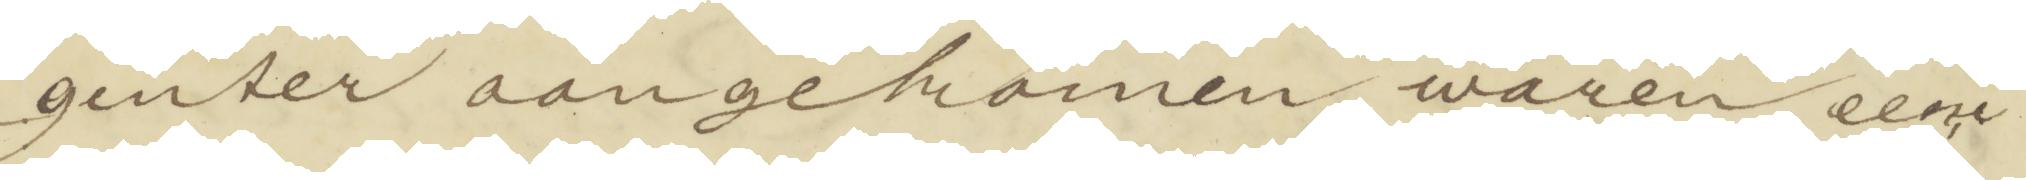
ginter aangekomen waren eeni
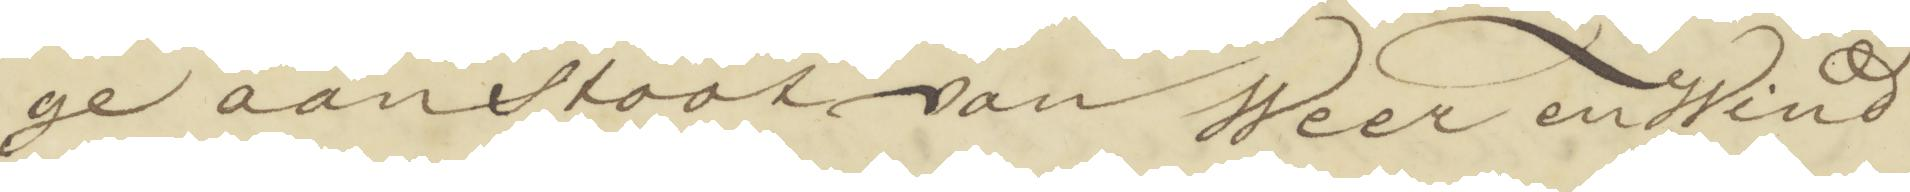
ge aanstoot van weer en Wind
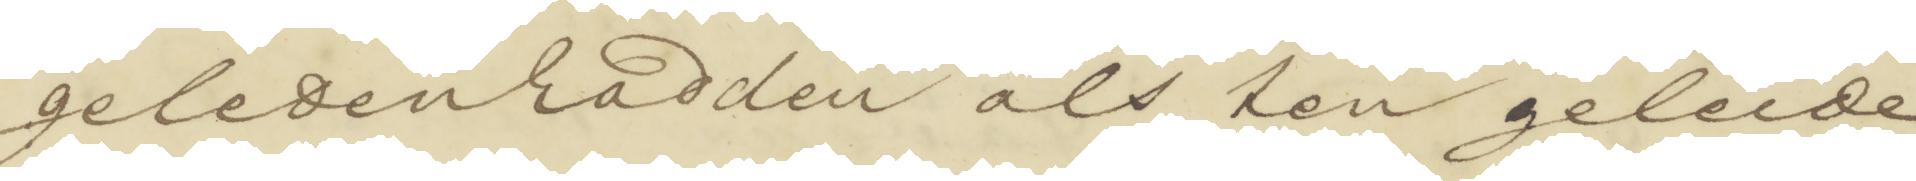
geleden hadden als ten geleide
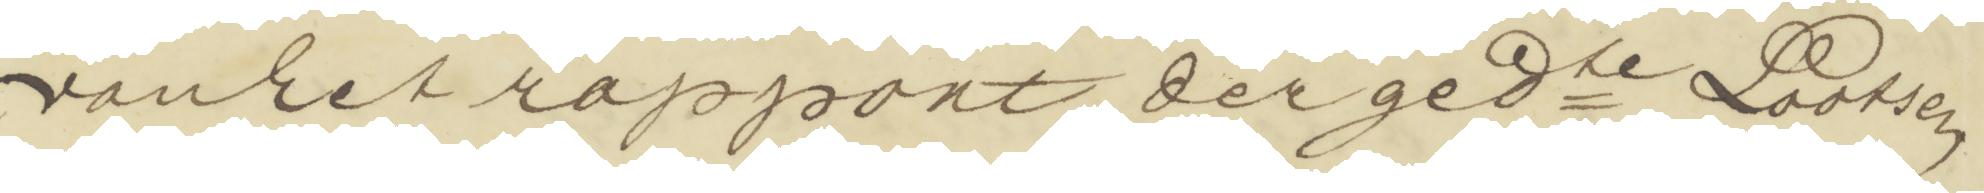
van het rapport der ged=te Lootsen
